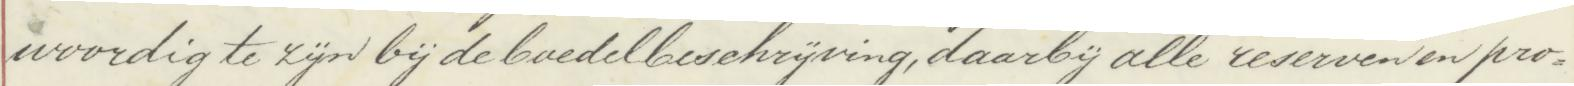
woordig te zijn bij de boedelbeschrijving, daarbij alle reserven en pro„
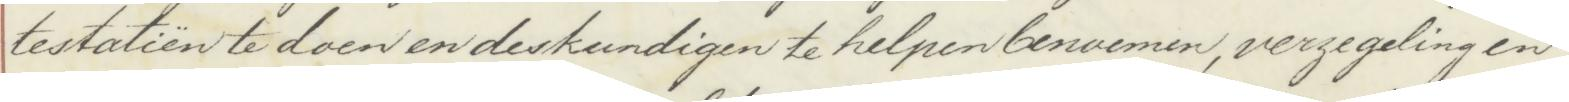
testatien te doen en deskundigen te helpen benoemen, verzegeling en
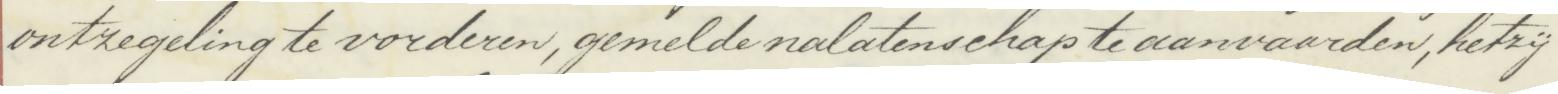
ontzegeling te vorderen, gemelde nalatenschap te aanvaarden, hetzij
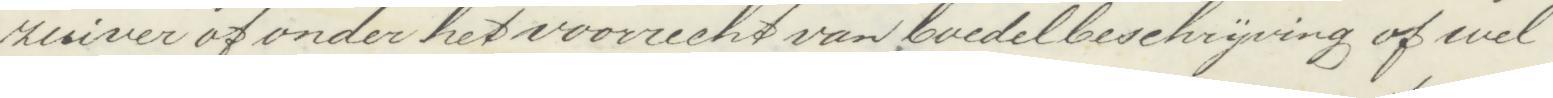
zuiver of onder het voorrecht van boedelbeschrijving of wel
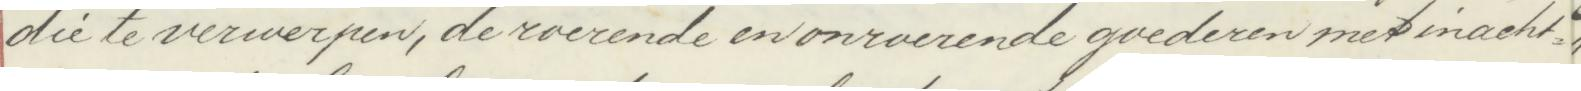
die te verwerpen, de roerende en onroerende goederen met in acht„
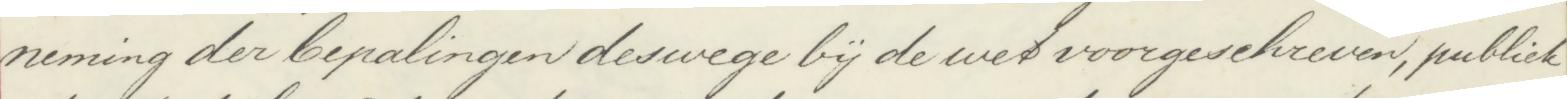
neming der bepalingen deswege bij de wet voorgeschreven, publiek
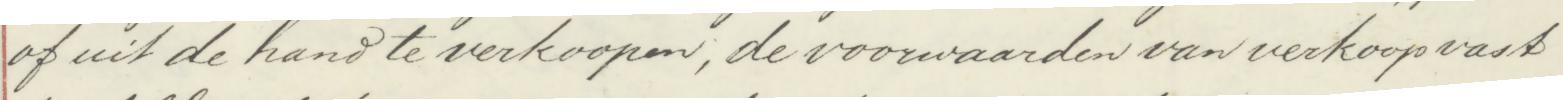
of uit de hand te verkoopen, de voorwaarden van verkoop vast
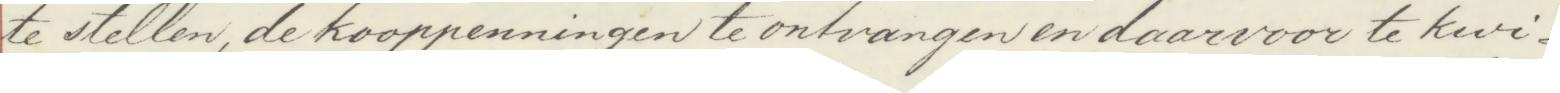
te stellen, de kooppenningen te ontvangen en daarvoor te kwi=
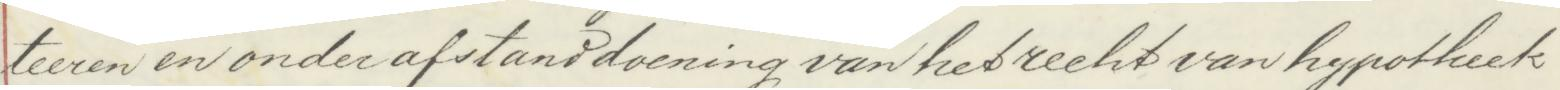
teeren en onder afstanddoening van het recht van hypotheek
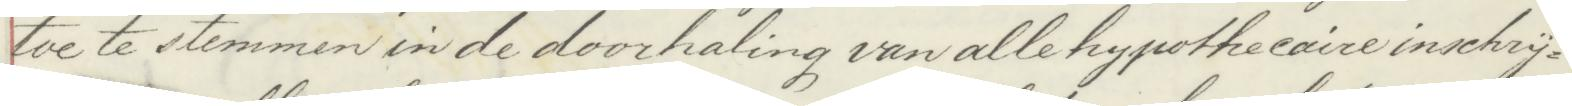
toe te stemmen in de doorhaling van alle hypothecaire inschrij=
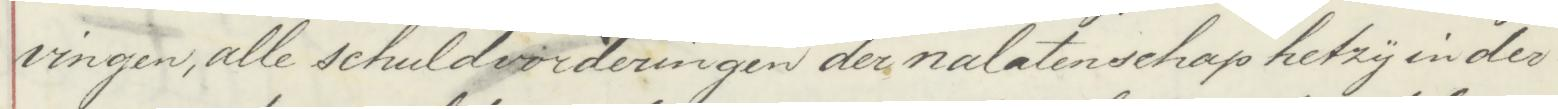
vingen, alle schuldvorderingen der nalatenschap hetzij in der
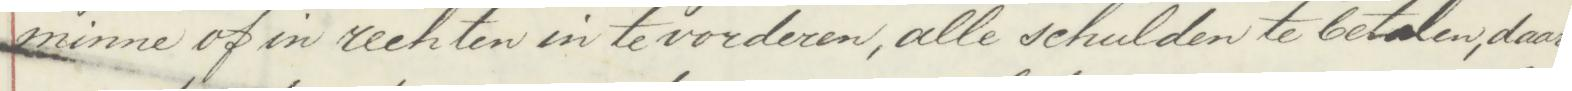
minne of in rechten in te vorderen, alle schulden te betalen, daar
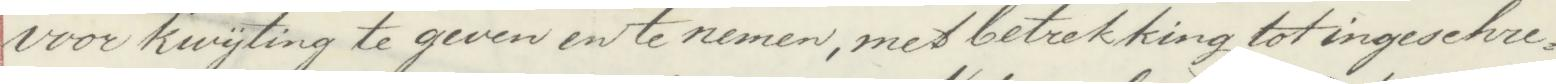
voor kwijting te geven en te nemen, met betrekking tot ingeschre„
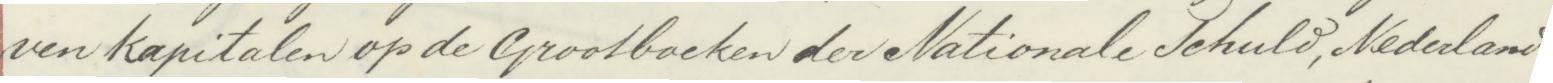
ven kapitalen op de Grootboeken der Nationale Schuld, Nederland
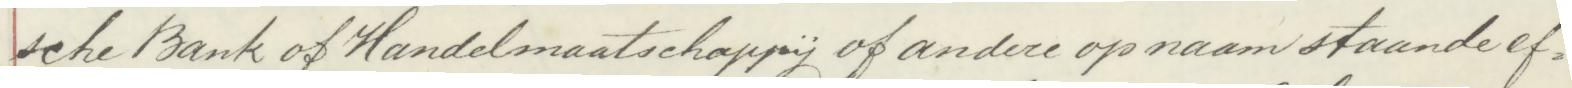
sche Bank of Handelmaatschappij of andere op naam staande ef„
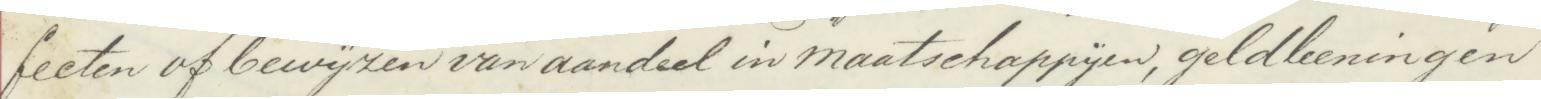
fecten of bewijzen van aandeel in maatschappijen, geldleeningen
